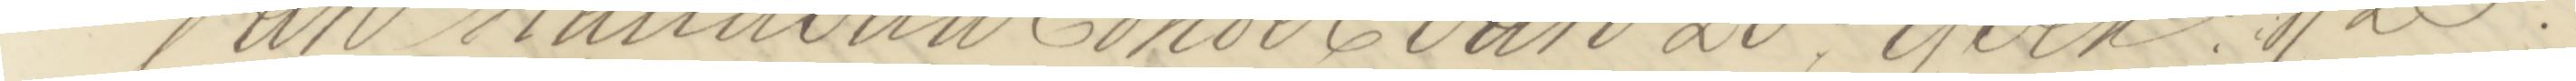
Van Mallabaar onder dato 20:e 9ber: 1725
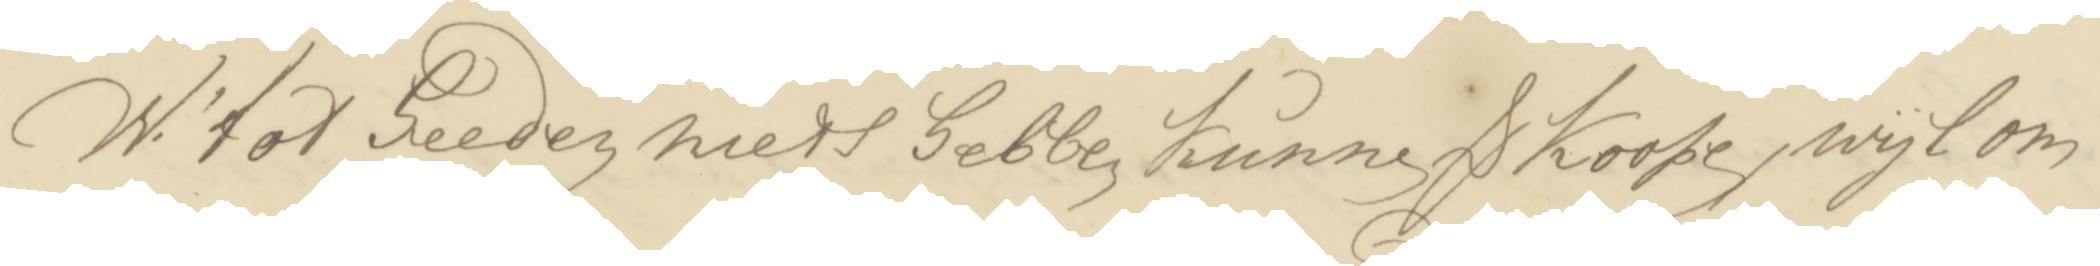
W.' tot heeden niets hebben kunne verkoopen, wijl om
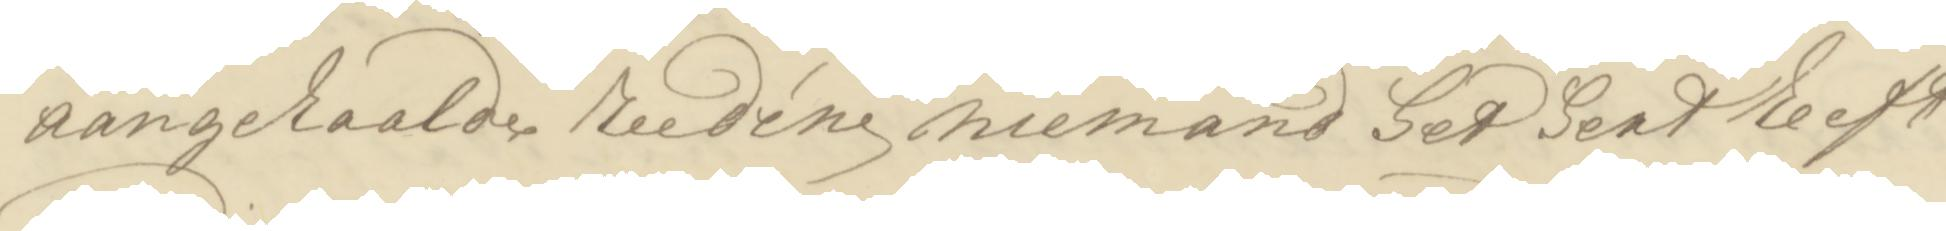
aangehaalde reedénen niemand het hert heeft
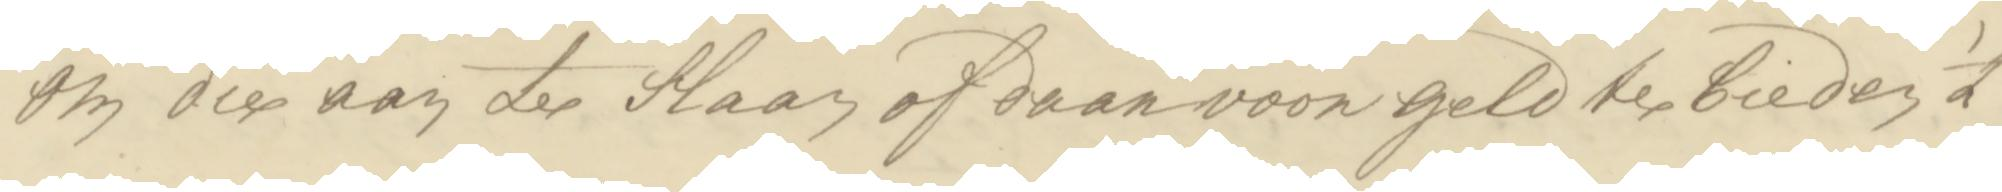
om die aan te slaan of daar voor geld te bieden 't
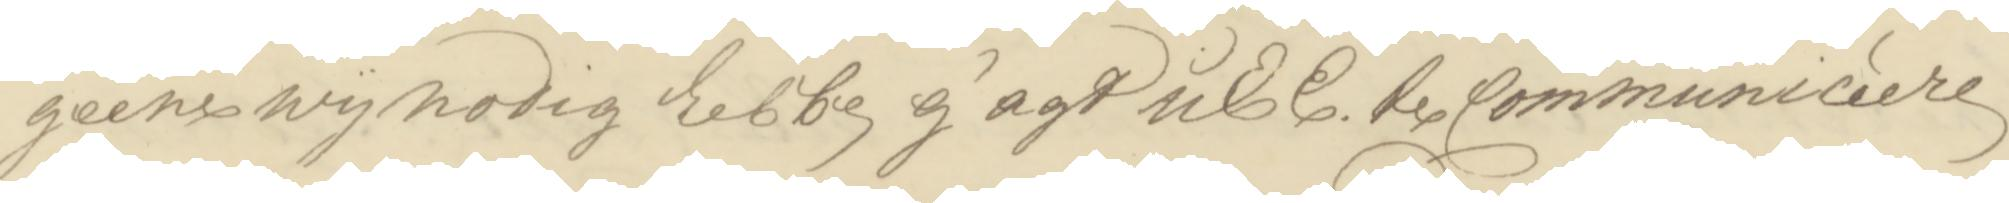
geene wij nodig hebben g’agt uEE. de communiceeren
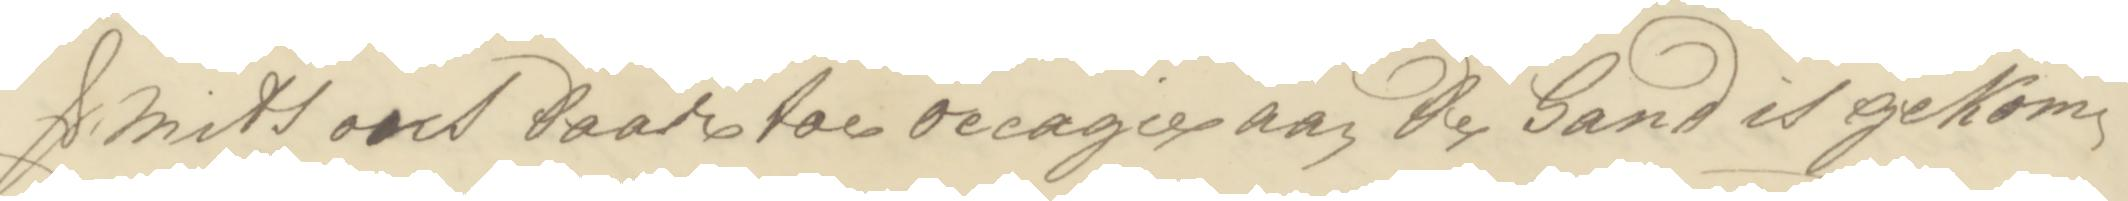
vermits ons daar toe occagie aan de hand is gekomen
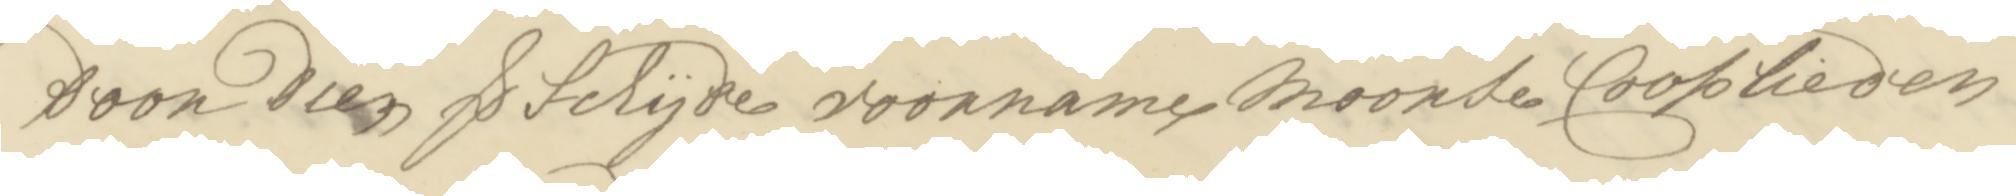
voor dien verschijde voorname moorse Cooplieden
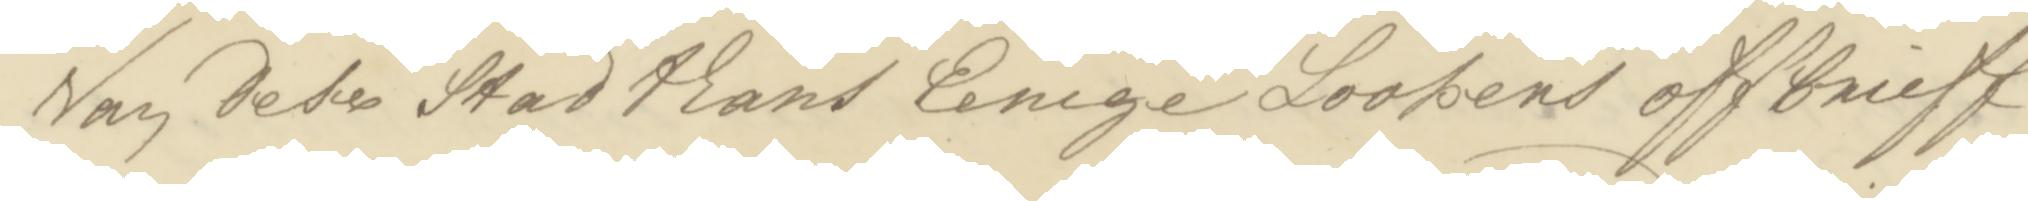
van dese stad thans Eenige Loopers off brieff
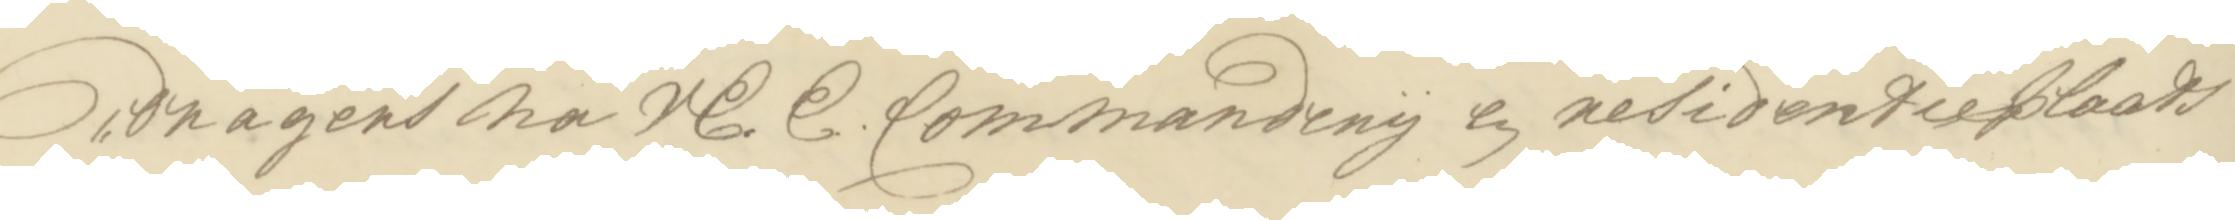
„dragers na VE. E. Commanderij en residentieplaats
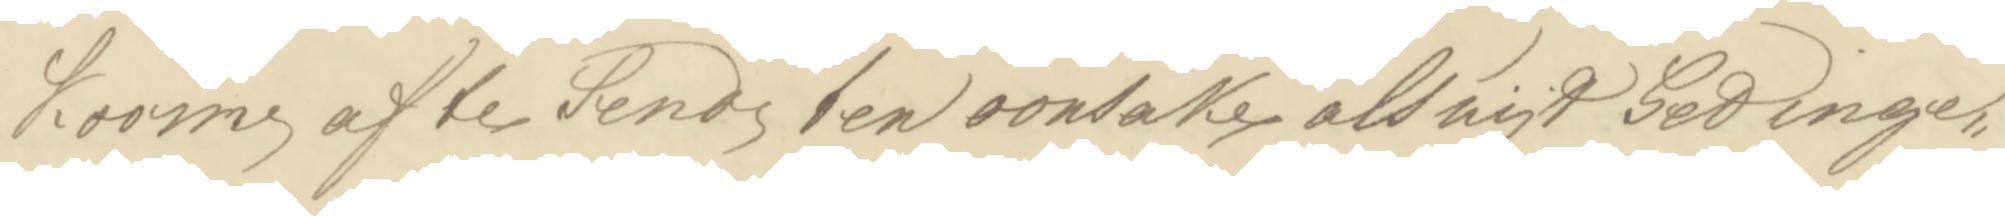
koomen af te senden ten oorsake als uijt hed inge„
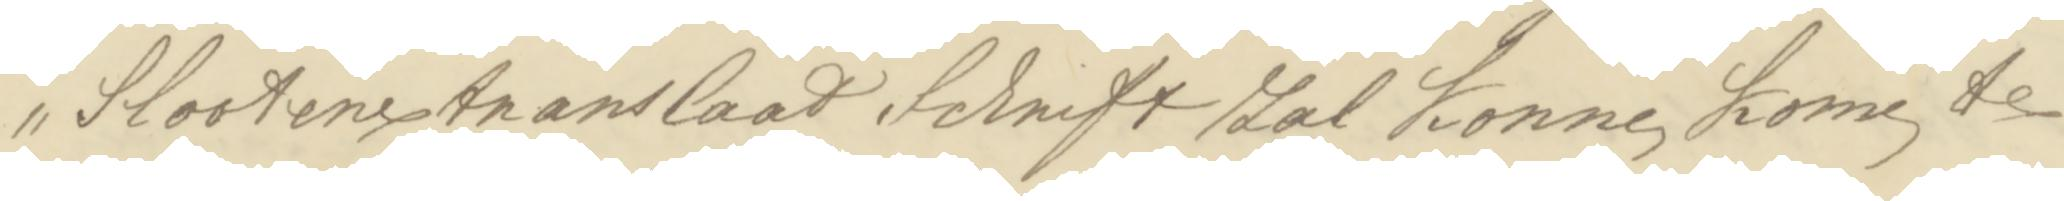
„slootene translaat schrift zal konnen komen te
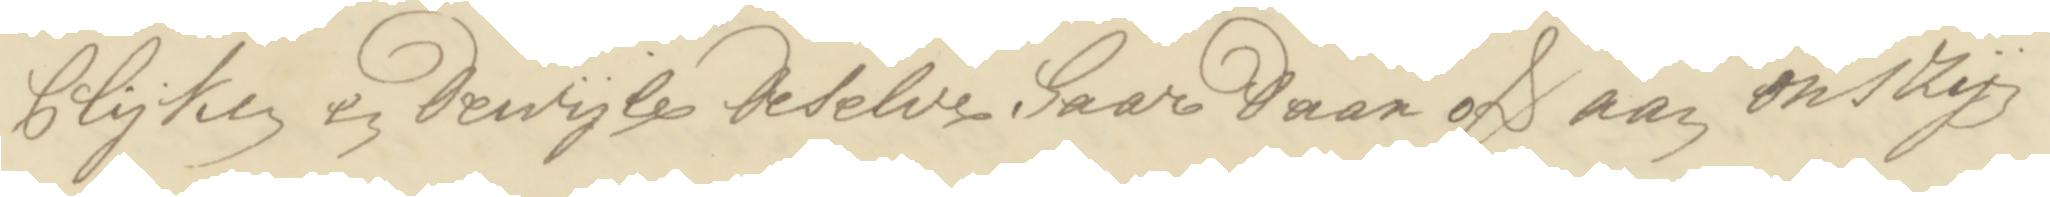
blijken en dewijle deselve haar daar over aan ons zijn
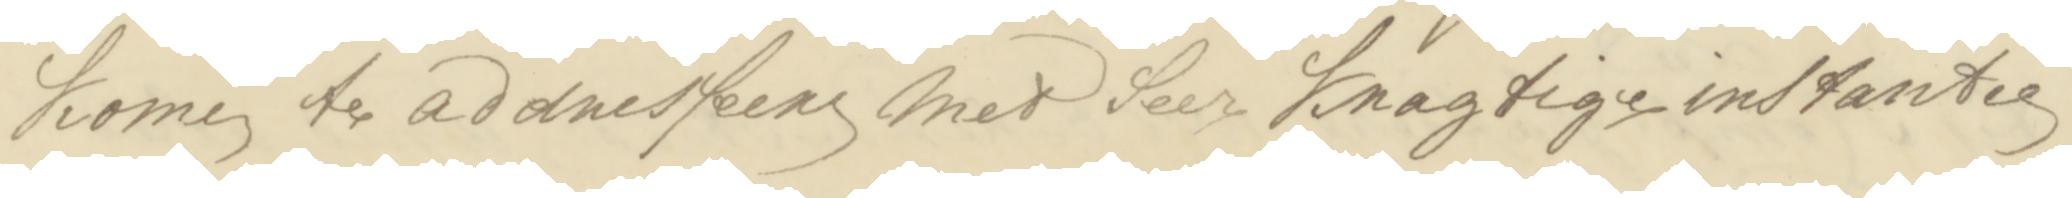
komen te addresseeren met seer kragtige instantien
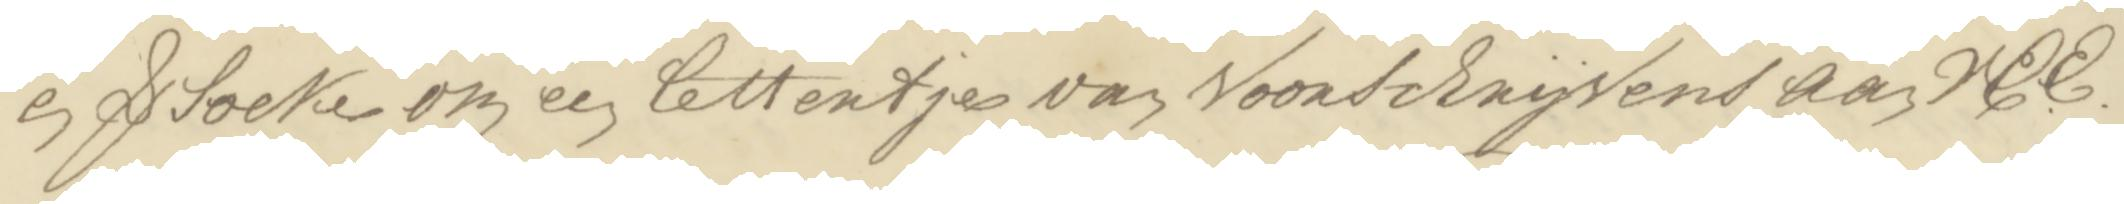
en versoeke om een lettertje van voorschrijvens aan VE.E.
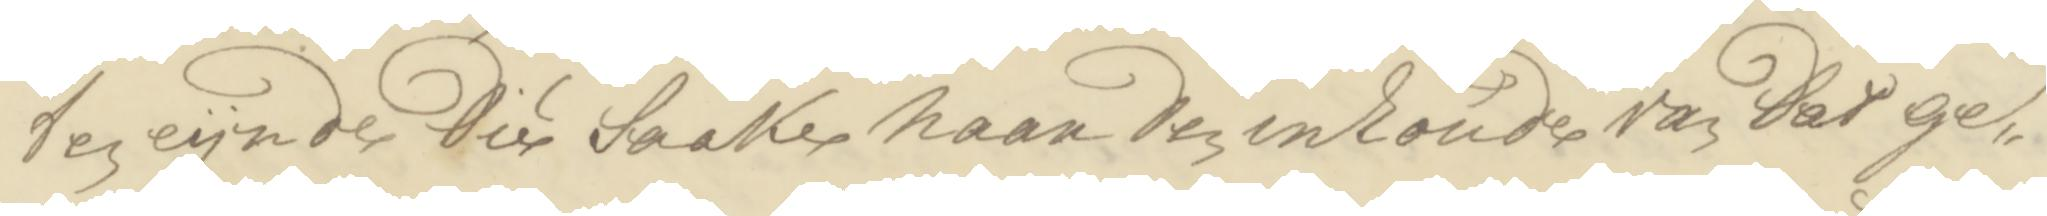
ten eijnde die saake naar den inhoude van dat ge„
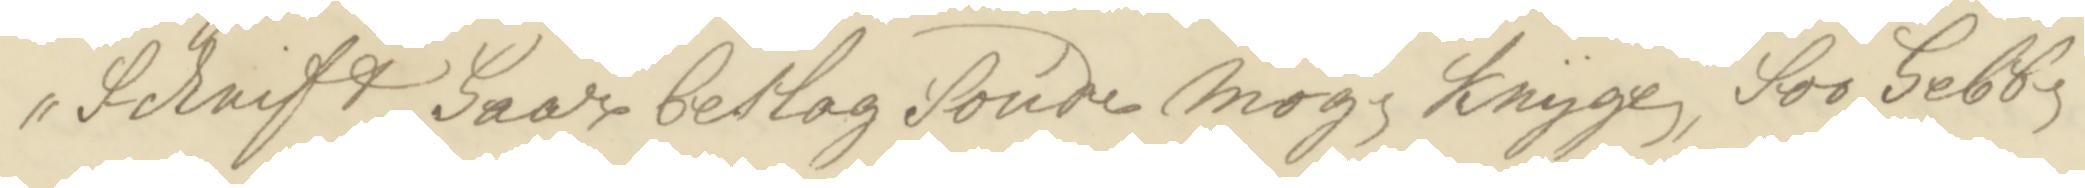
„schrift, haar beslag soude mogen krijgen, soo hebben
